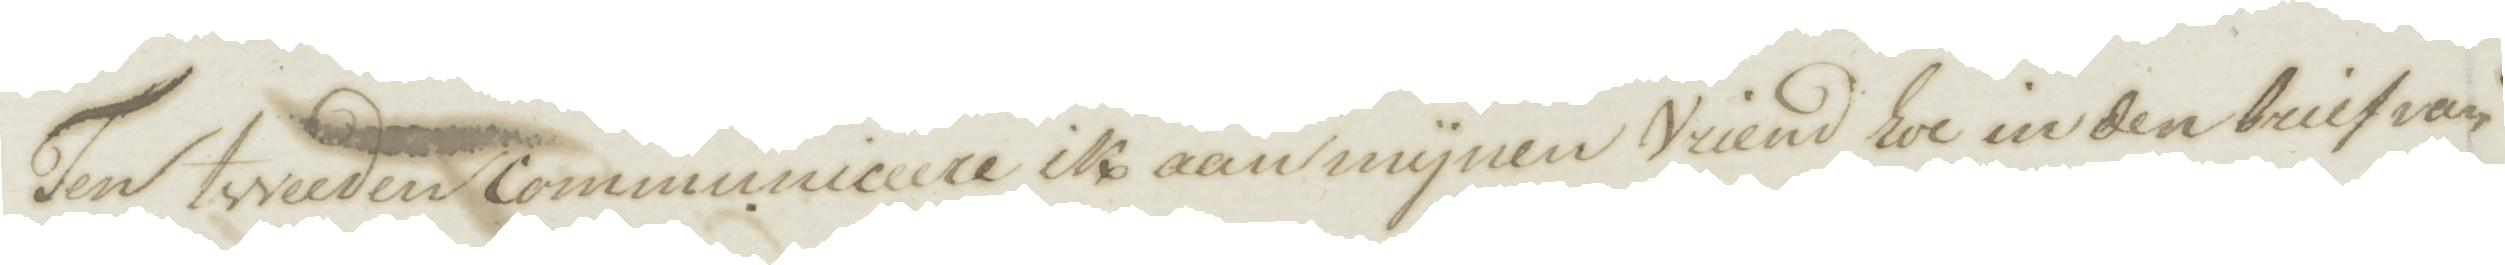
Ten tweeden communiceere ik aan mijnen Vriend hoe in den brief van
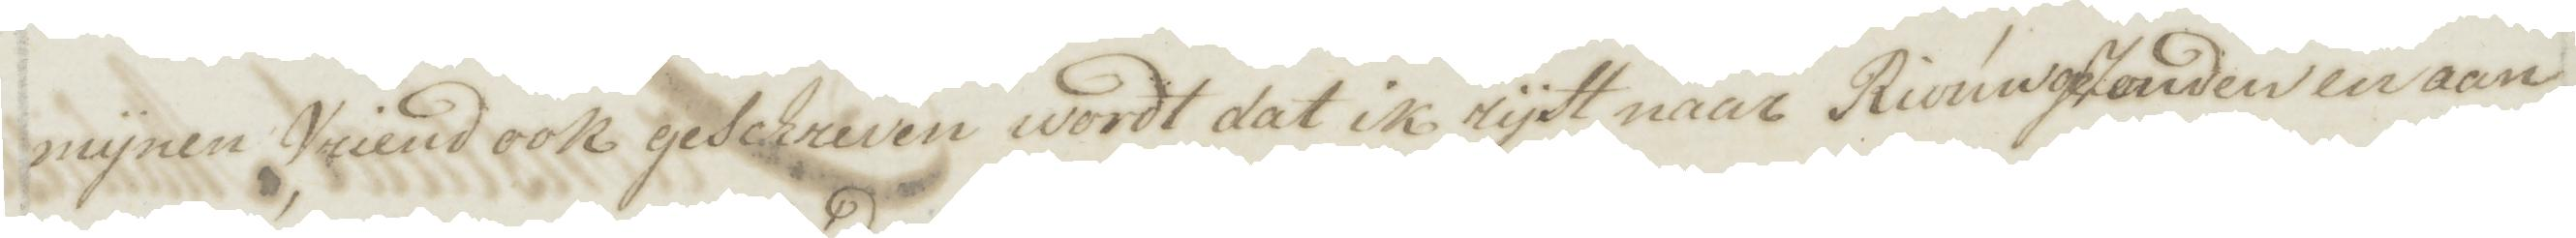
mijnen Vriend ook geschreven wordt dat ik rijst naar Riouw gezonden en aan
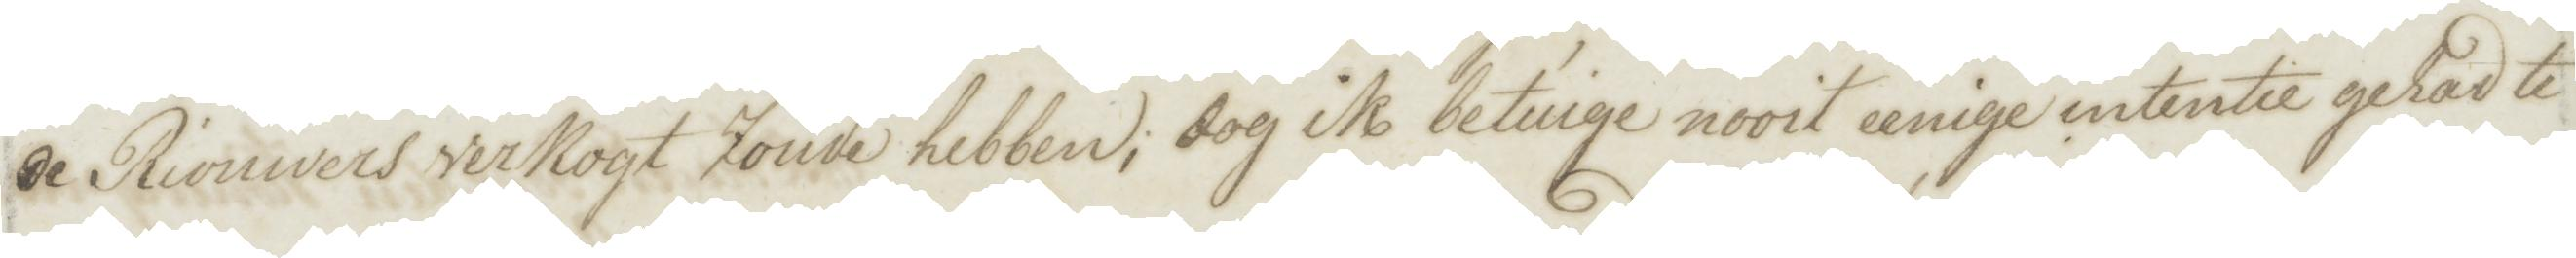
de Riouwers verkogt zoude hebben; dog ik betuige nooit eenige intentie gehad te
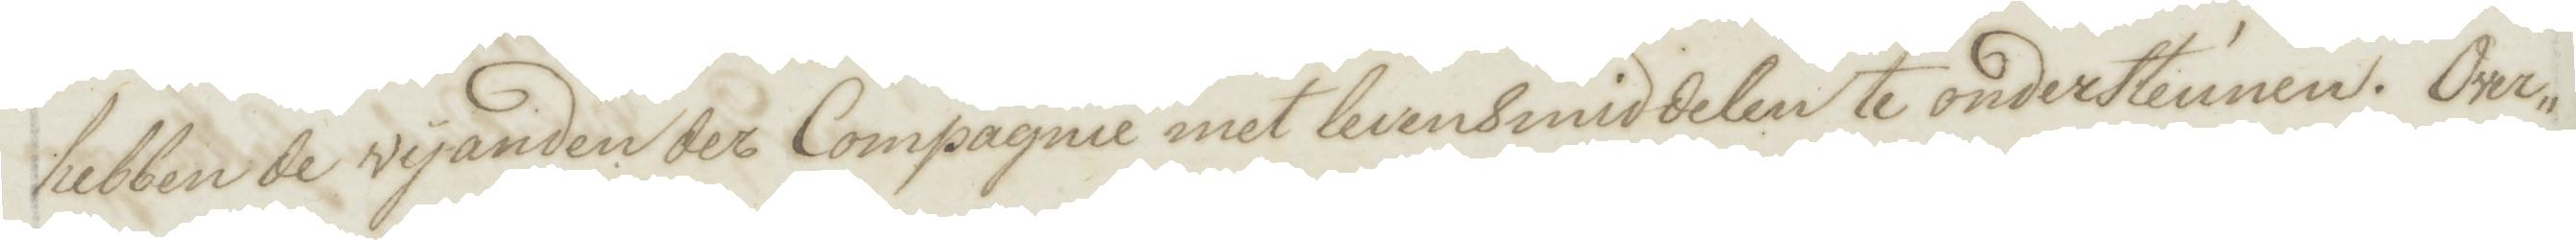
hebben de vijanden der Compagnie met levensmiddelen te ondersteunen. Over„
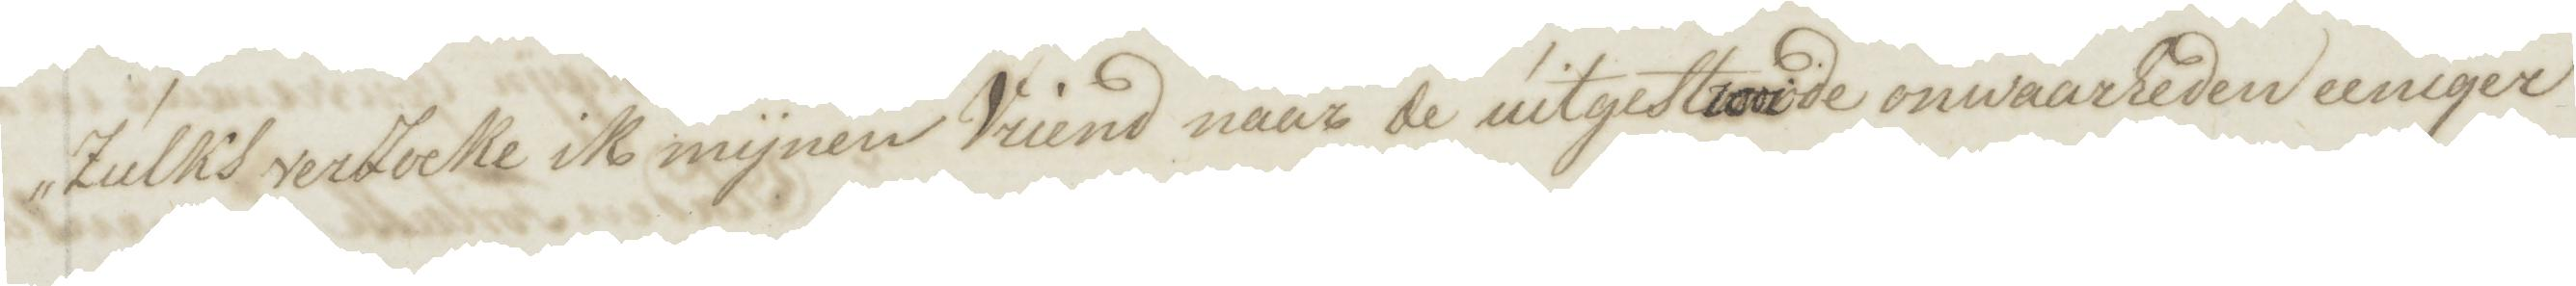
„zulks verzoeke ik mijnen Vriend naar de uitgestrooide onwaarheden eeniger
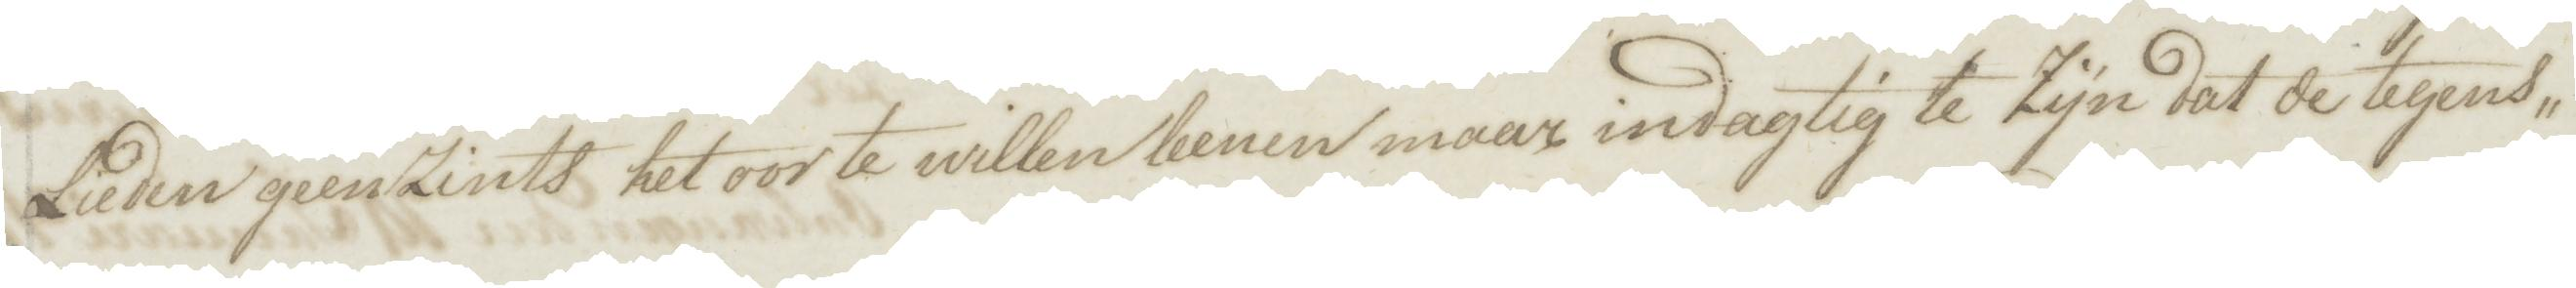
Lieden geenzints het oor te willen leenen maar indagtig te zijn dat de tegens„
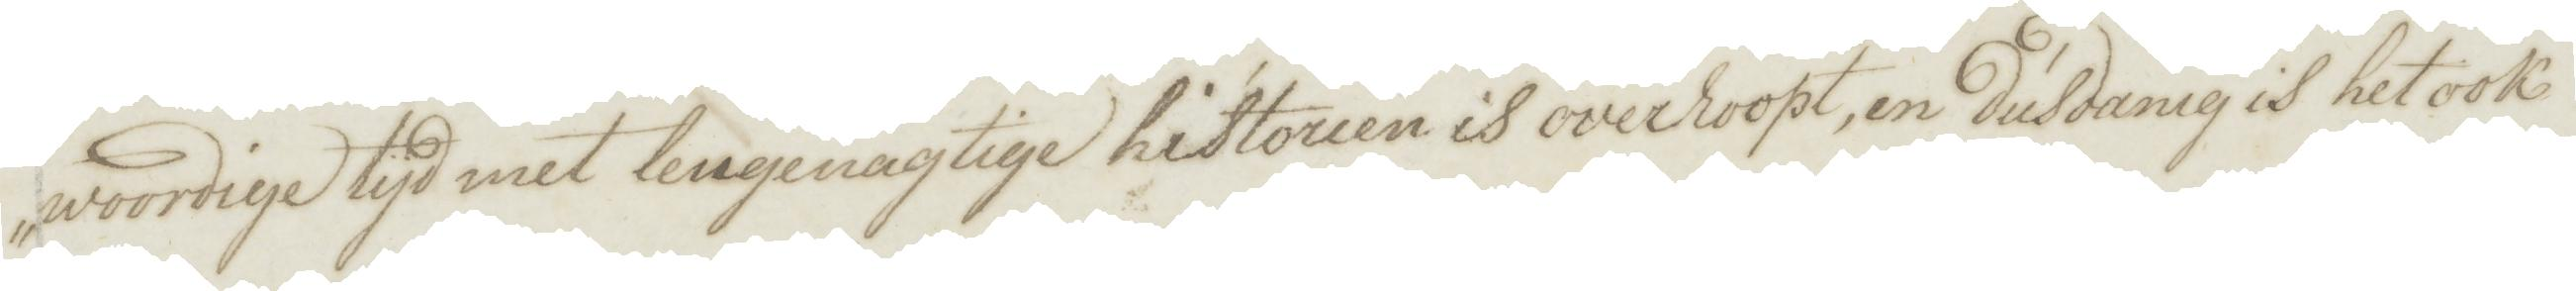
„woordige tijd met leugenagtige historien is overhoopt, en dusdanig is het ook
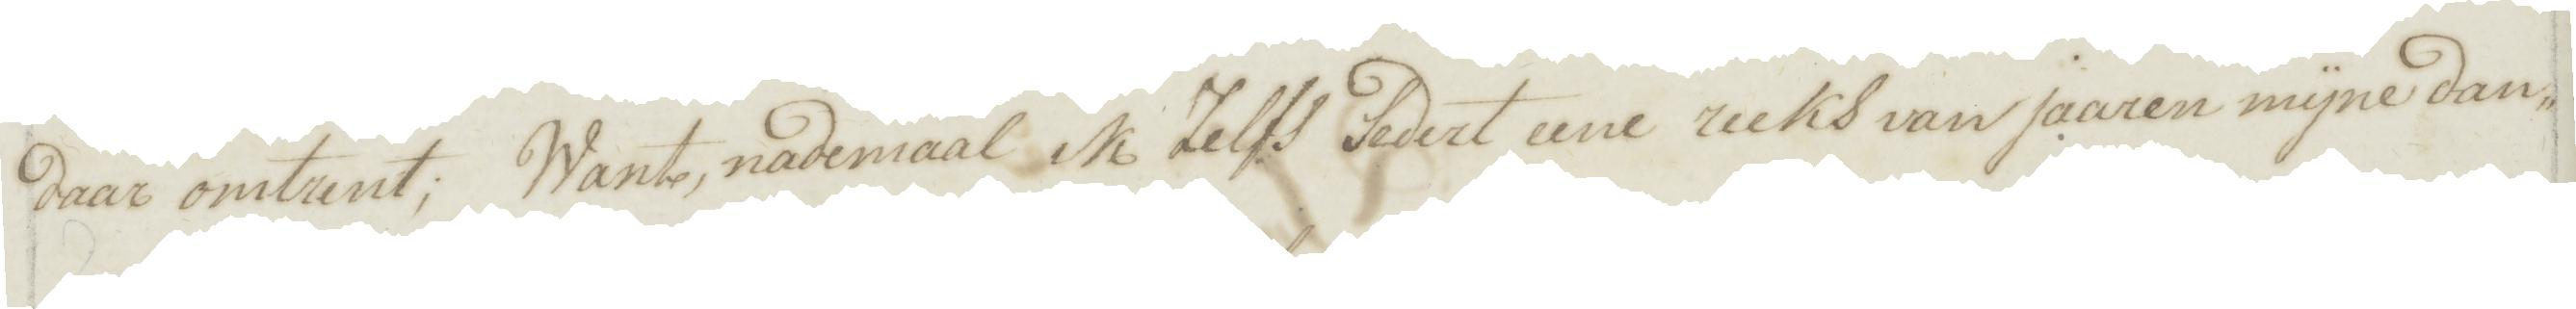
daar omtrent; Want, nademaal ik zelfs sedert eene reeks van jaaren mijne dan„
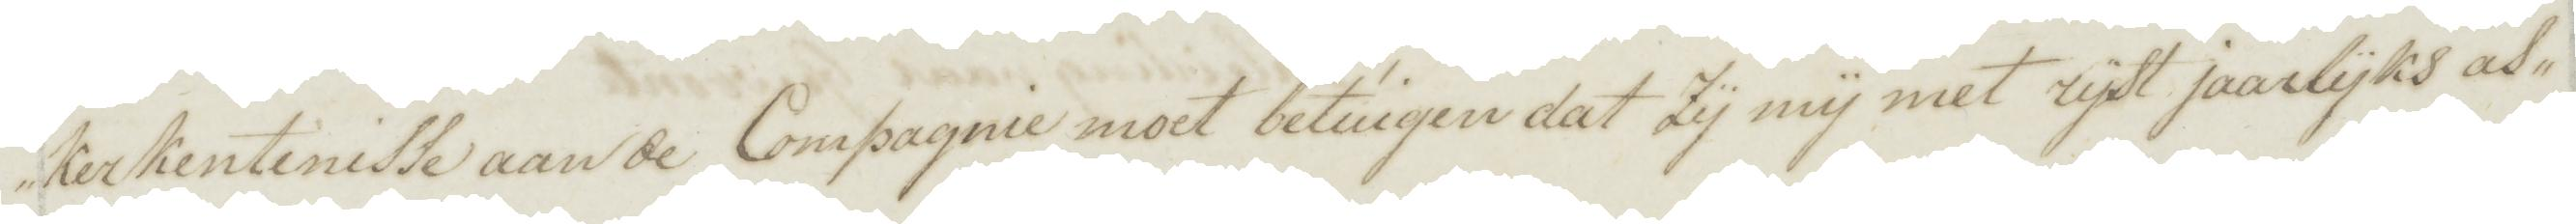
ƒkerkentinisse aan de Compagnie moet betuigen dat zij mij met rijst jaarlijks as„
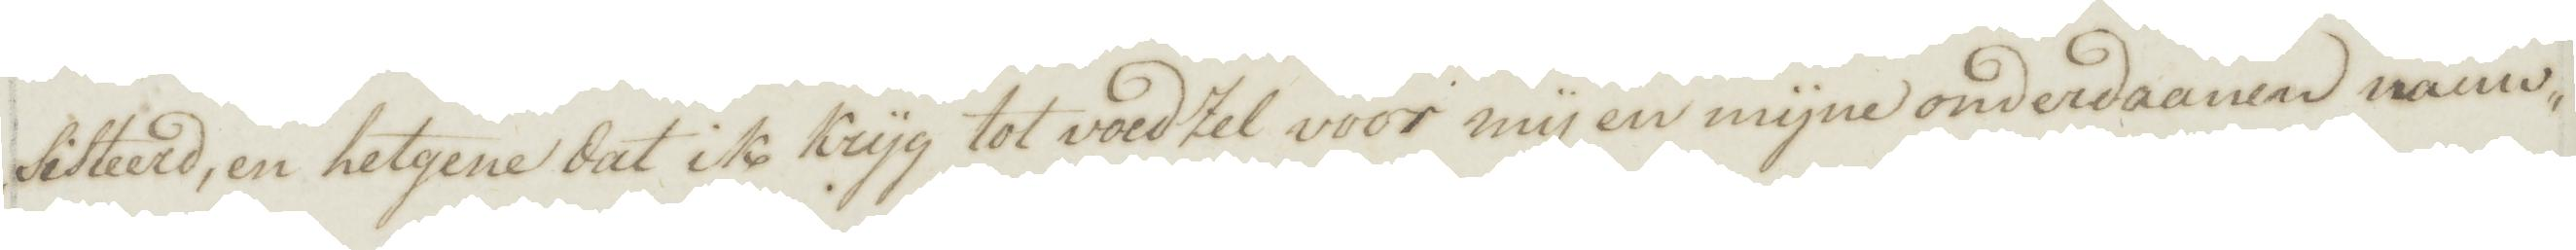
sisteerd, en hetgene dat ik krijg tot voedzel voor mij en mijne onderdaanen nauw„
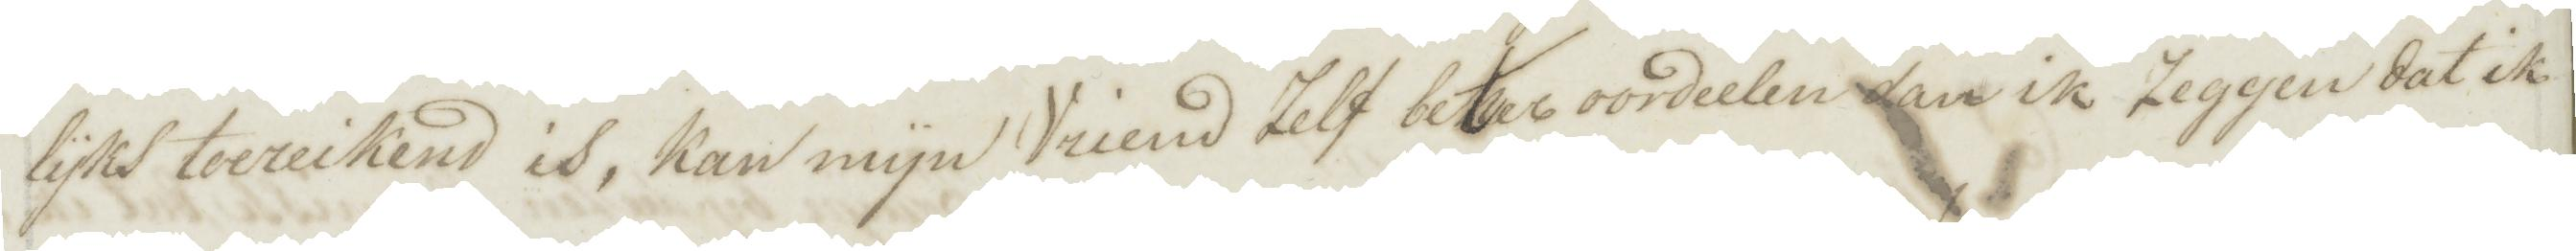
lijks toereikend is, kan mijn Vriend zelf beter oordeelen dan ik zeggen dat ik
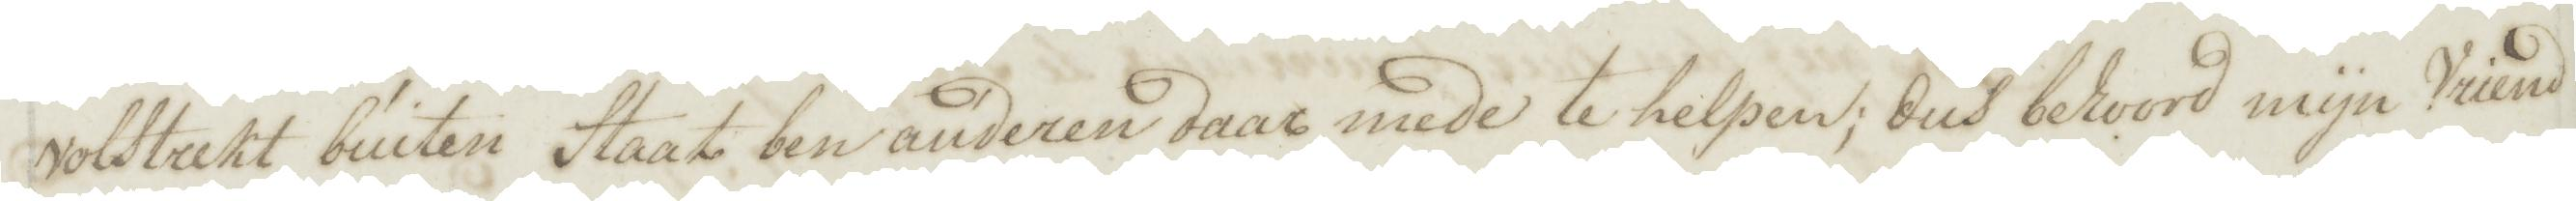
volstrekt buiten staat ben anderen daar mede te helpen; dus behoord mijn Vriend
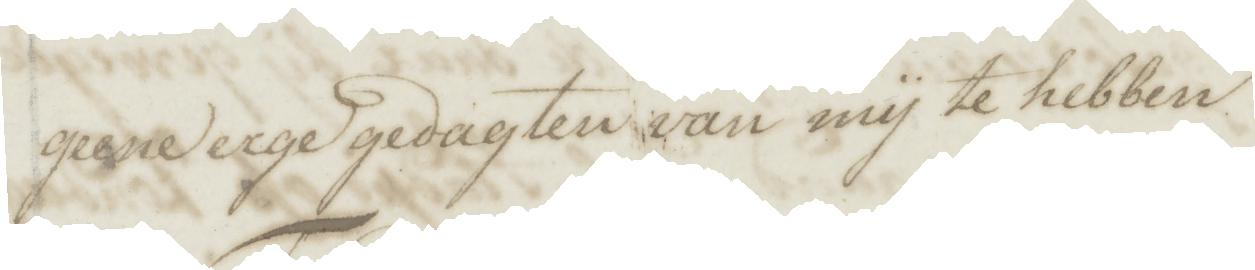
geene erge gedagten van mij te hebben
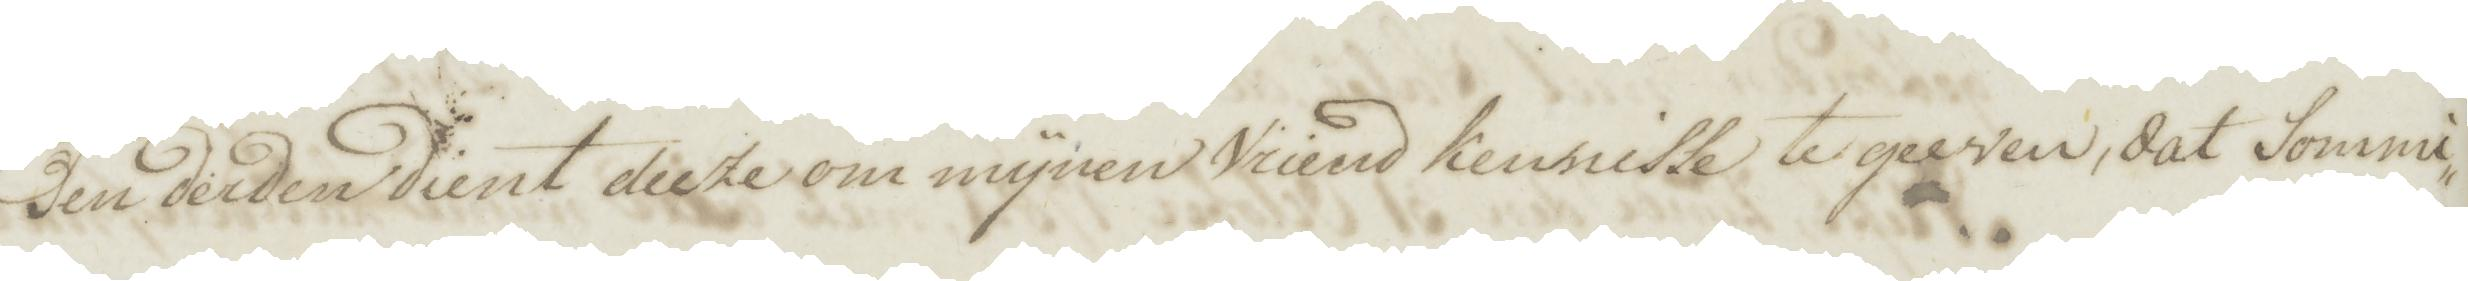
Ten derden dient deeze om mijnen Vriend kennisse te geeven, dat sommi„
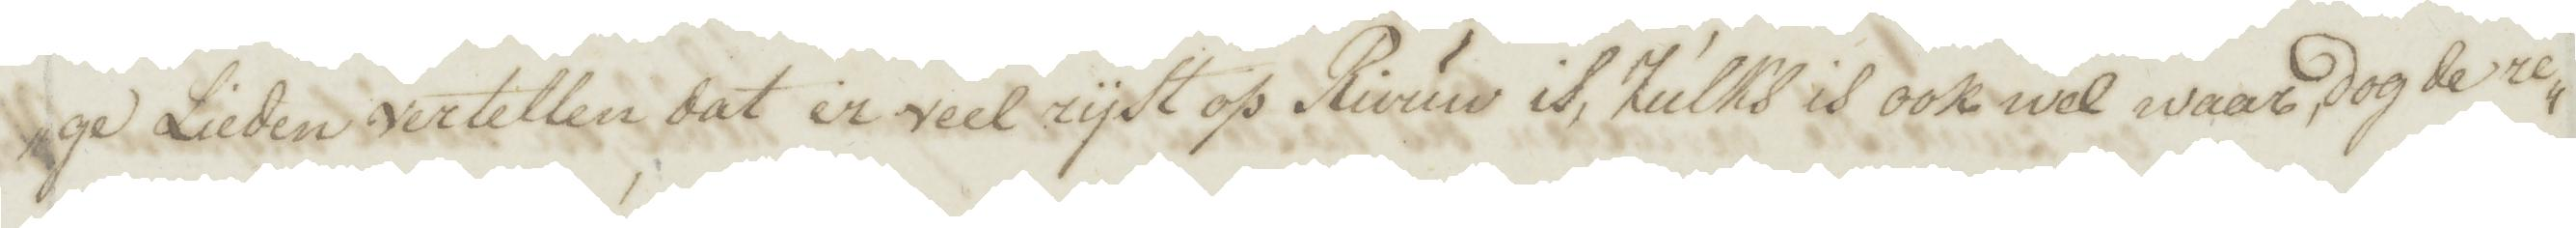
„ge Lieden vertellen dat er veel rijst op Riouw is, zulks is ook wel waar, dog de re„
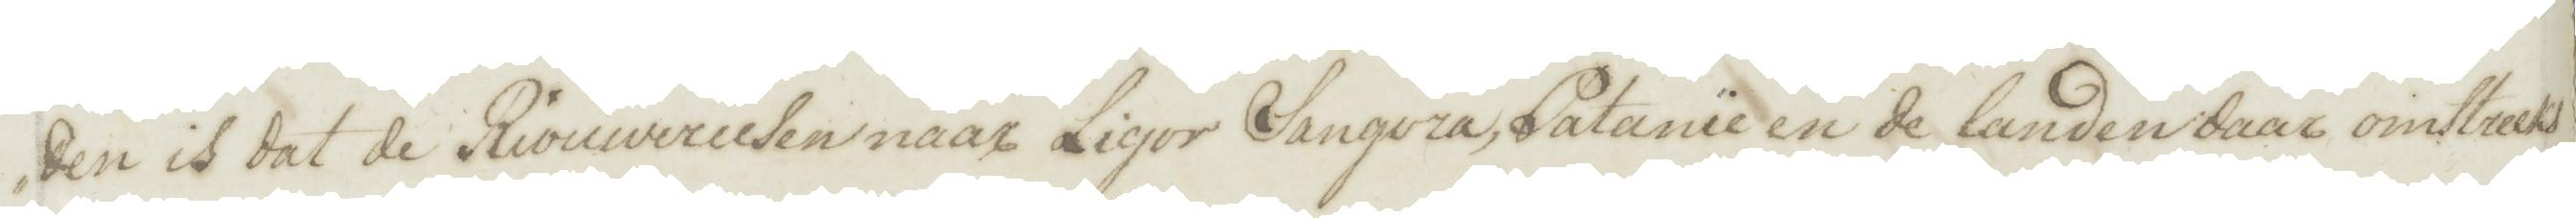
„den is dat de Riouwereesen naar Ligor Sangora, Patanïe en de landen daar omstreeks
